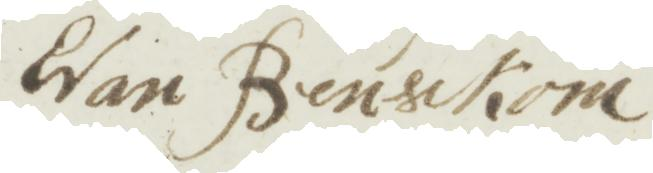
EVan Beusekom
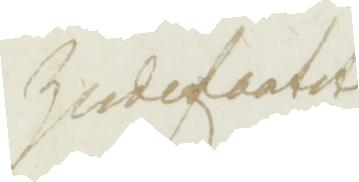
Ziedelaatste
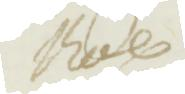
Rol
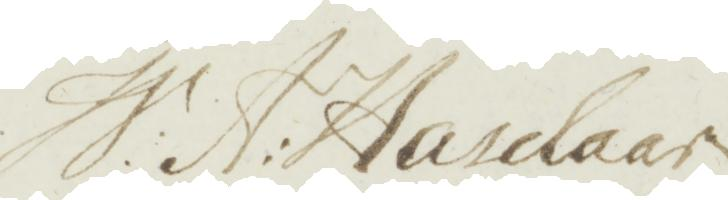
W: A. Haselaar
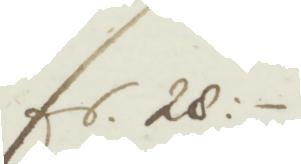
ƒr. 28: -
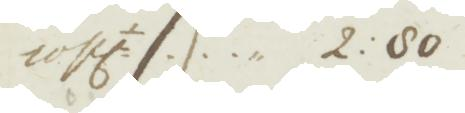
10 pC:t . . . . „ 2: 80
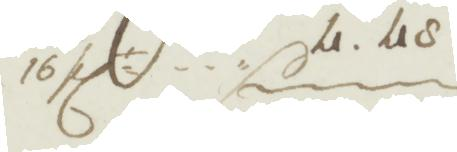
16 pC:t . . . . 4. 48
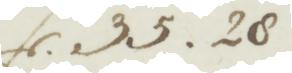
ƒr. 35. 28
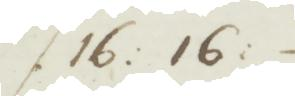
ƒ 16: 16:-
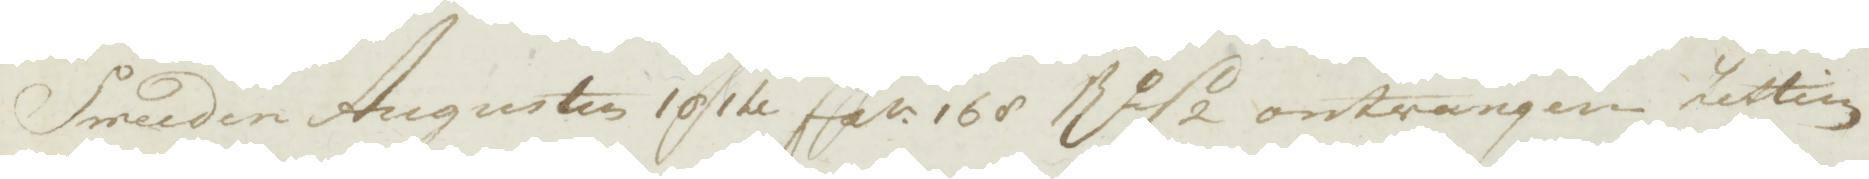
Tweeden Augustus 1814 fak. 168 N:o C2 ontvangen Zestien
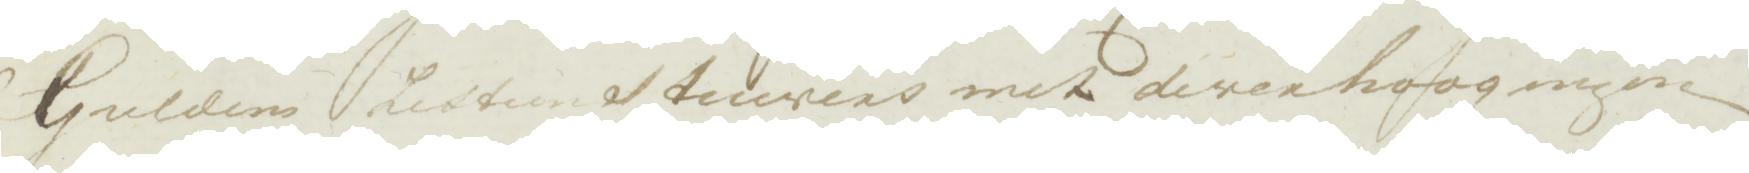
Gulden zestien stuivers met de verhoogingen
